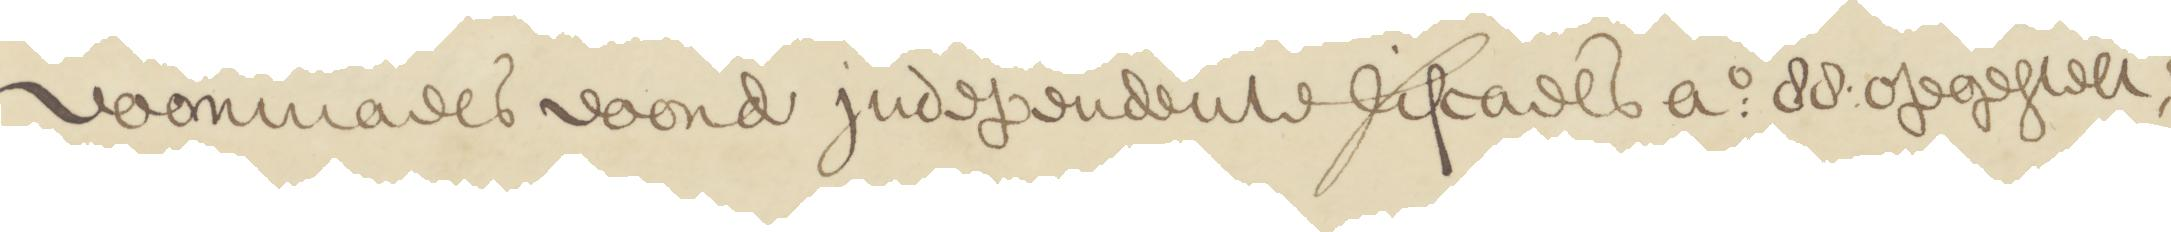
voormaels voorde jndependente fiscaels a:o 88: opgestelt,
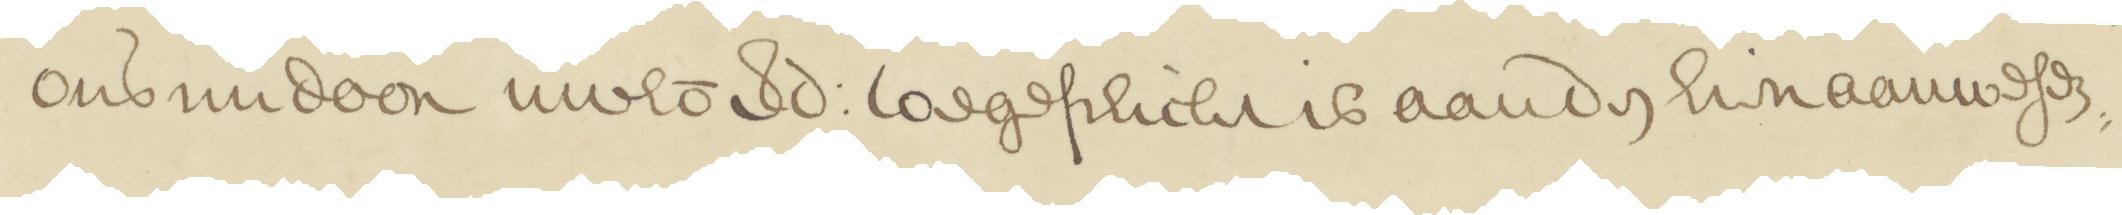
ons nu door uwho Ed: toegeschickt is aanden hier aanwesen„
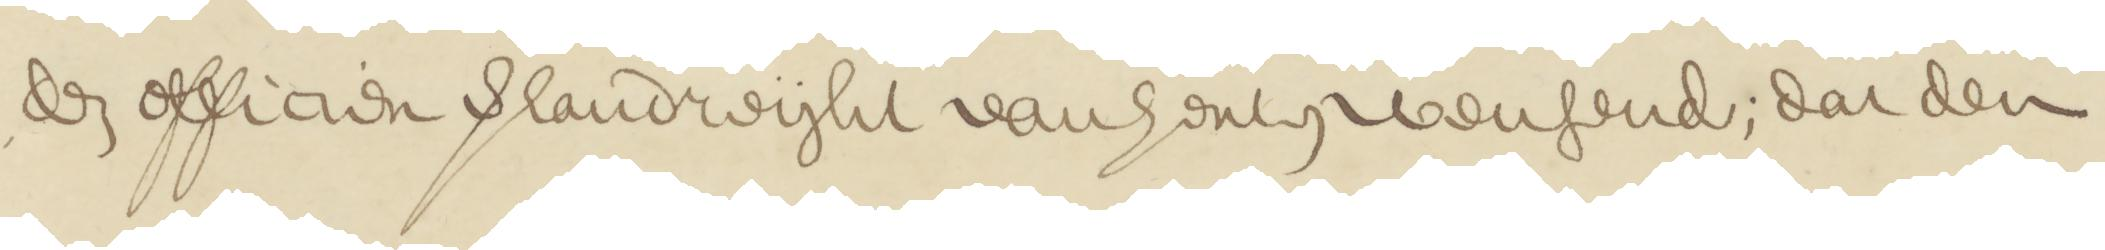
„den officier verhandreijkt van herten wensende; dat den
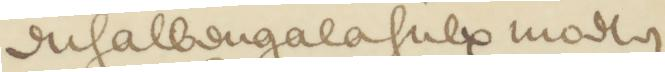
en sal bengala sulx moeten
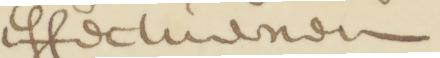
Effectueren
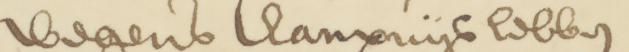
wegens thanpuijs hebben
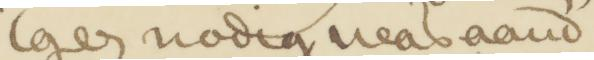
'tgeen nodig was aand’
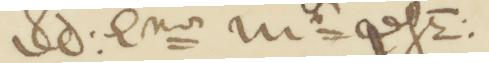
Ed: h=ren m=s gesz:
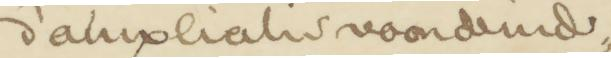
d’ampliatie voordeinde„
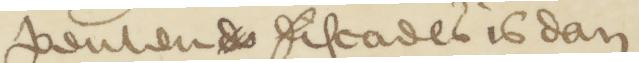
penten de fiscaels is dan
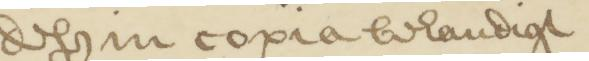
desen in copia behandigt
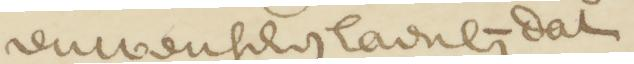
en wenschen haerl dat
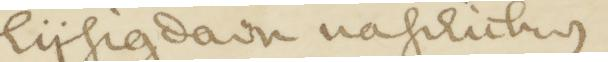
hijsig daer naschicken
